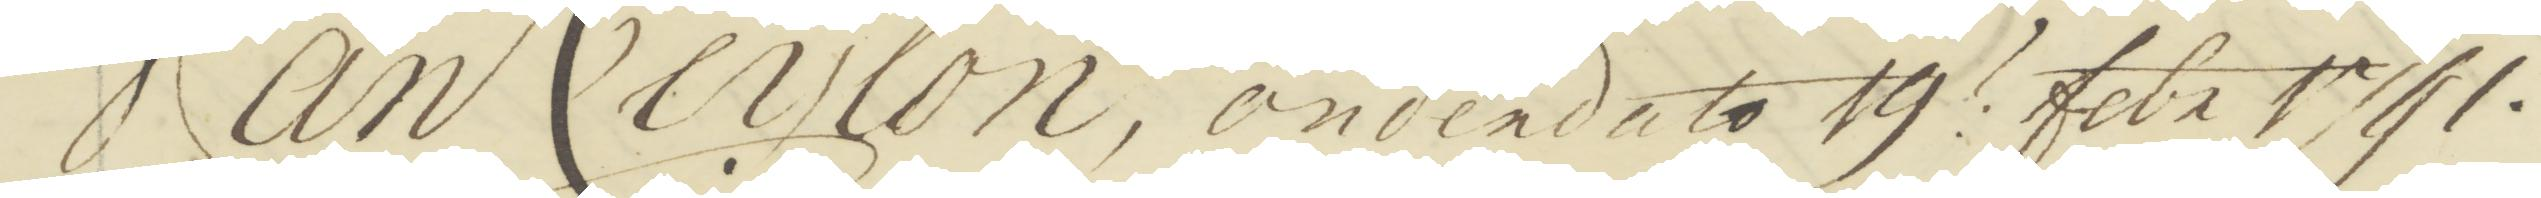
Van Ceijlon, onder dato 19:' febr 1741.
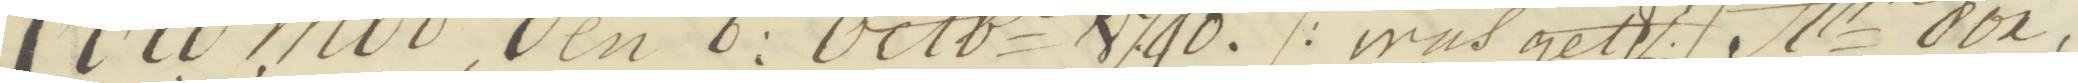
Colombo den 6:' Octb=r 1740. /: was getd:/ A=m dor„
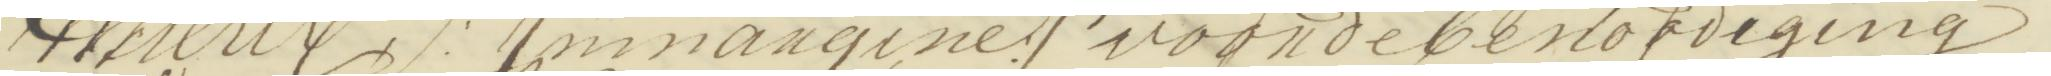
mieux/: Jn margine:/ voorde benoodiging
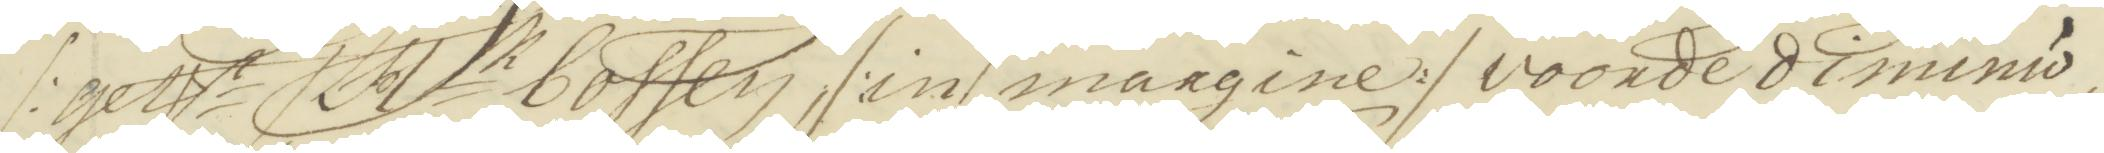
/:gets=t M:r bossen, /:in margine:/ voorde diminu„
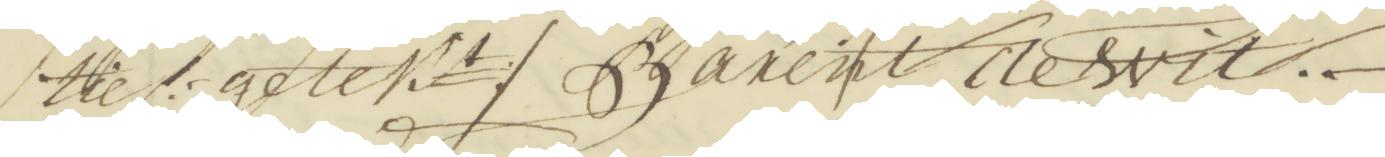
tie/: getek=t:/ Barent de wit.—
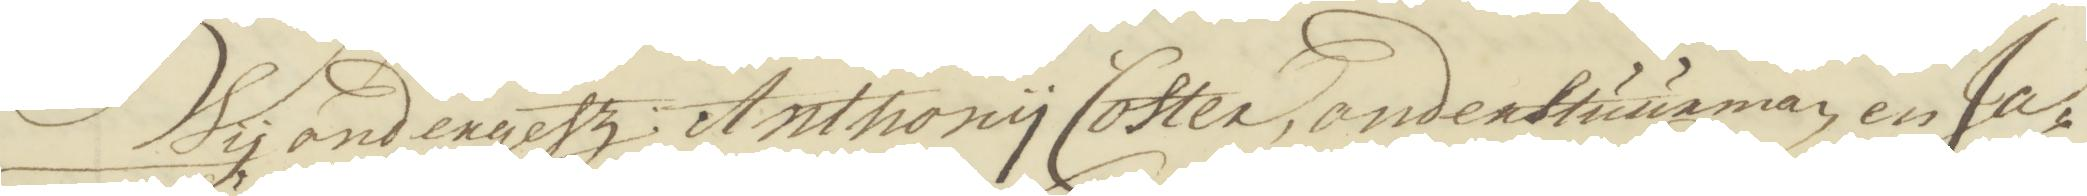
Wij ondergesz: Anthonij Coster, onderstuurman en Ja„
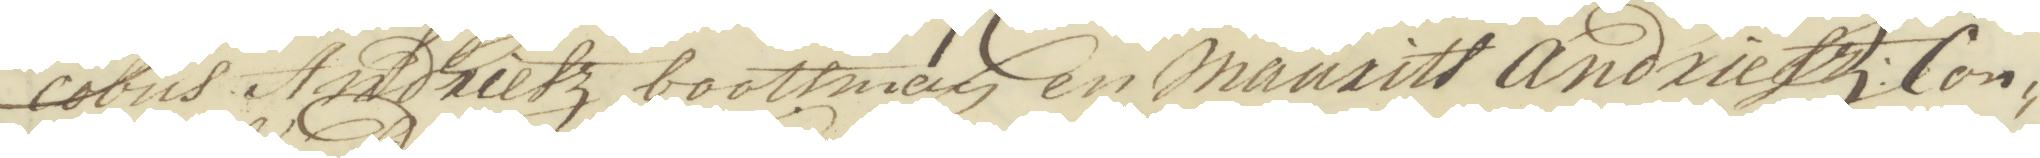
cobus Andriesz bootsman en maurits andriesz: Con„
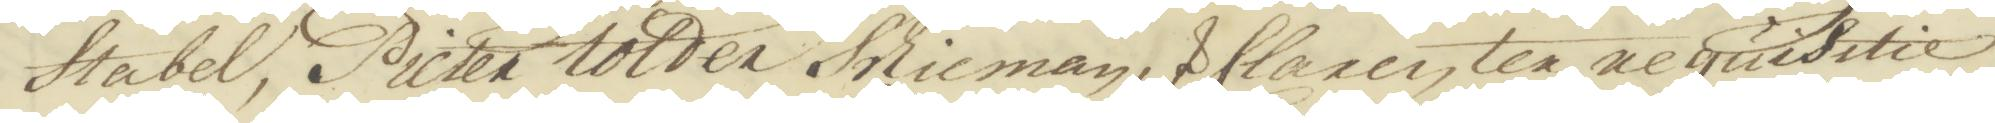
stabel, Pieter tolder schieman, verclaren ter requisitie
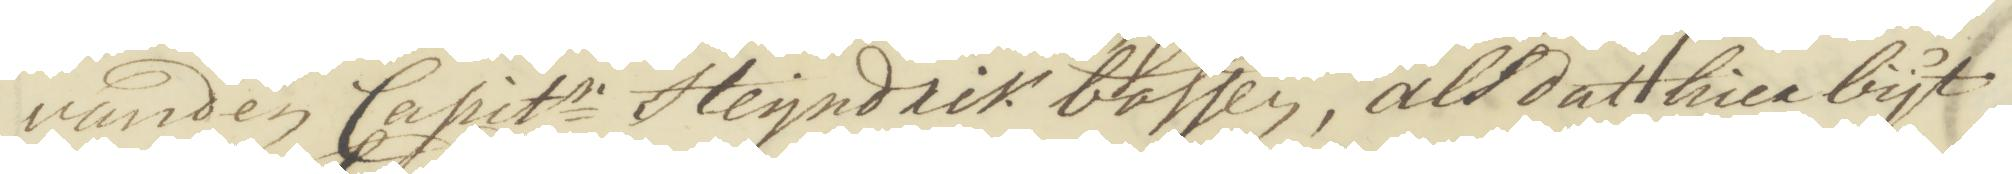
van den Capit=n Heijndrik bossen, als dat hier bij't
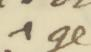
^ ge
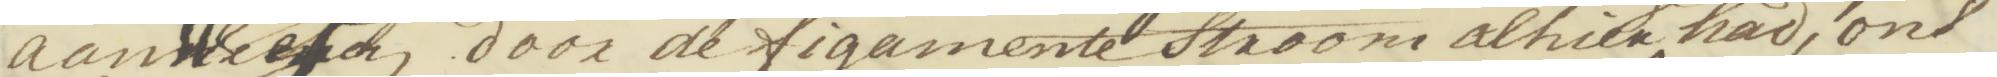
aan weesen door de figamente stroom alhier ^ had, ons
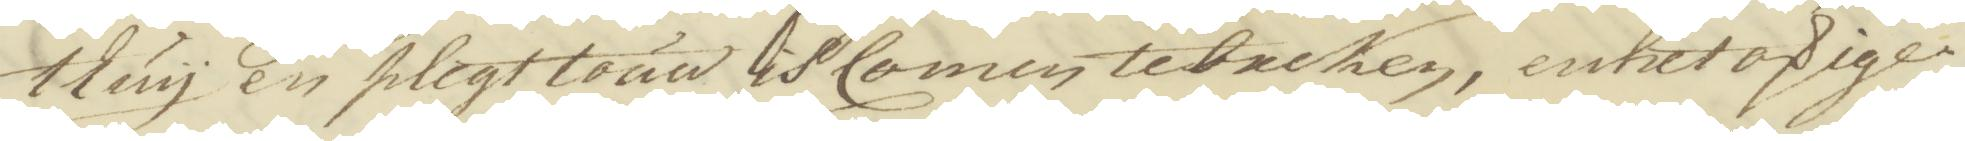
thuij en plegttouw is Comen te breken, en het overige
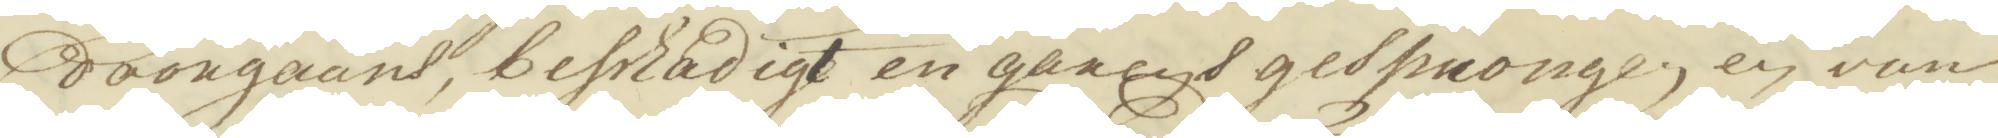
doorgaans, beschadigt en garens gesprongen en van
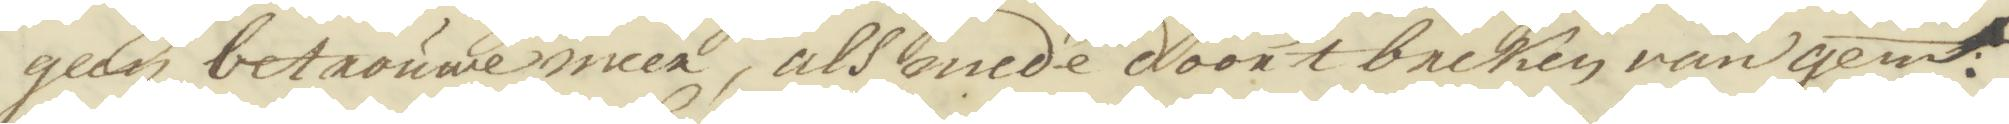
geen betrouwe meer, als mede door 't breken van gem:t
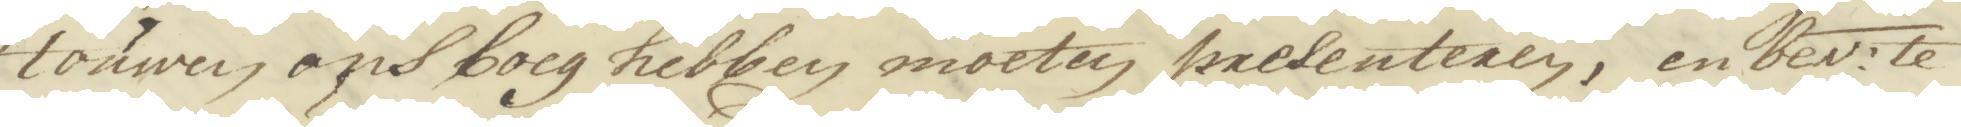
touwen ons boeg hebben moeten presenteren, en bev: te
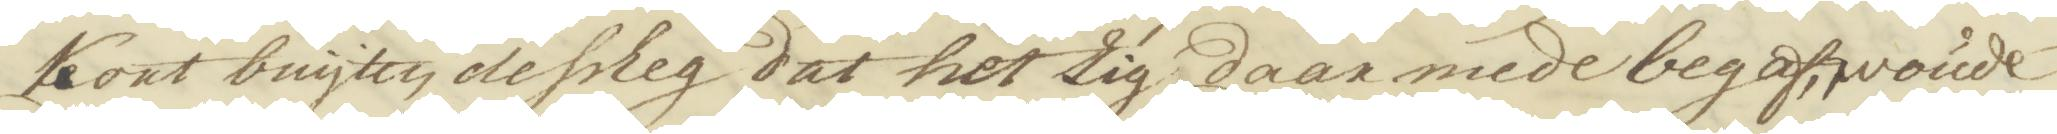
kort buijten de scheg dat het zig daar mede beg af, woude
